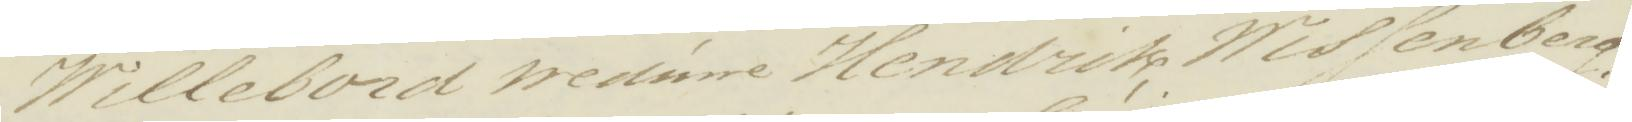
Willebord weduwe Hendrik Wissenberg,
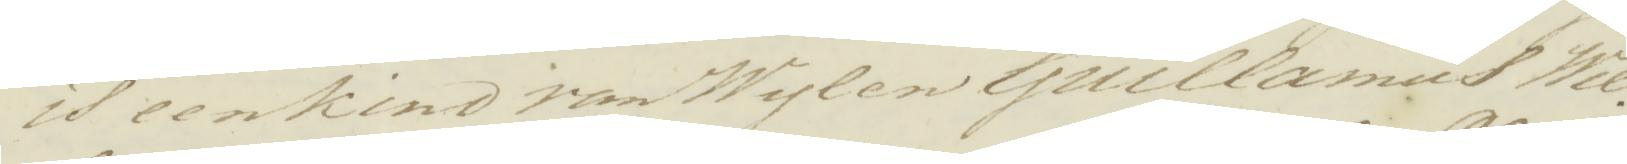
is een kind van Wylen Guillamus Wil„
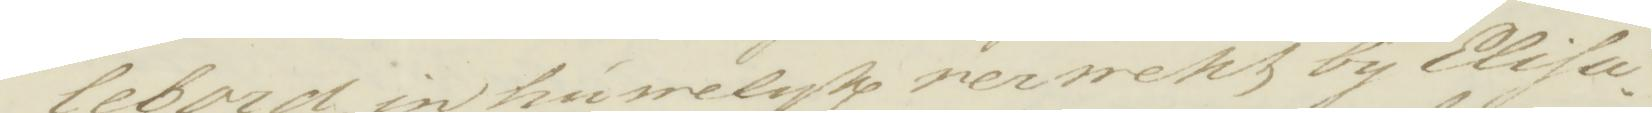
lebord, in huwelyk verwekt by Elisa„
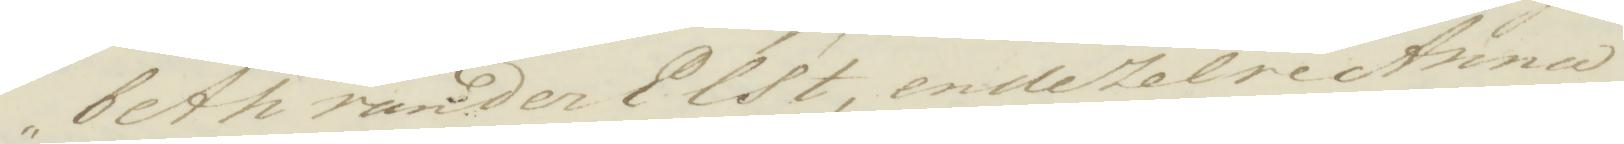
„beth van der Elst, en dezelve Anna
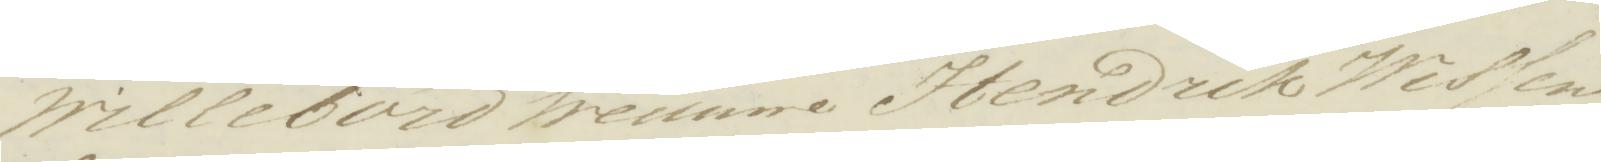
Willebord weduwe Hendrik Wissen
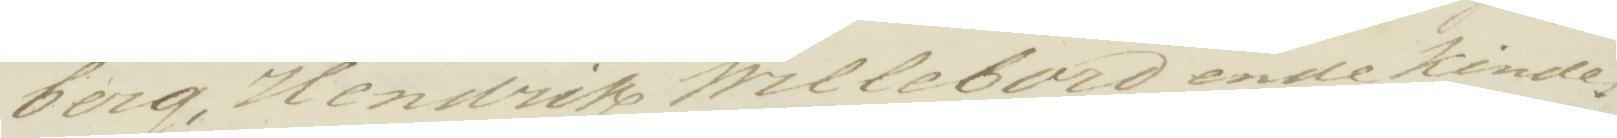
berg, Hendrik Willebord en de kinde„
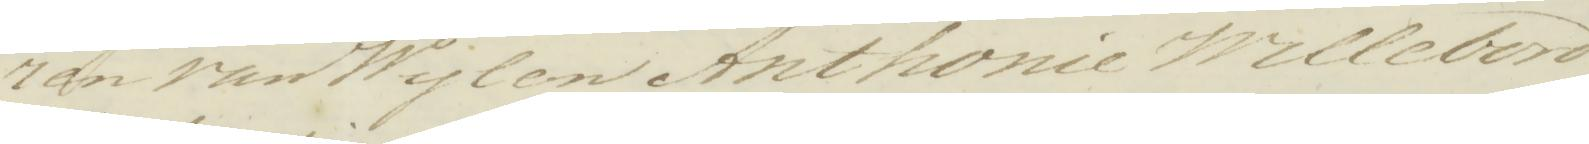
ren van Wijlen Anthonie Willebord,
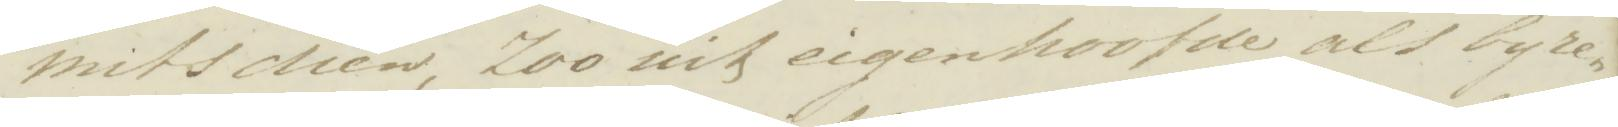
mitsdien, zoo uit eigen hoofde als by re„
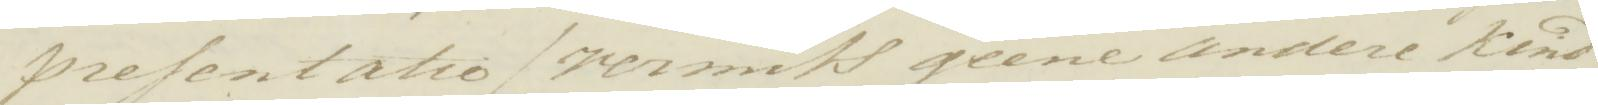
presentatie / vermits geene andere kind
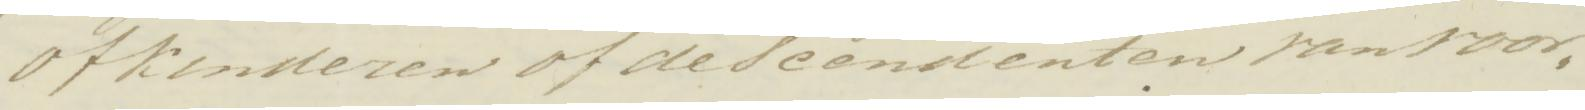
of kinderen of descendenten van voor„
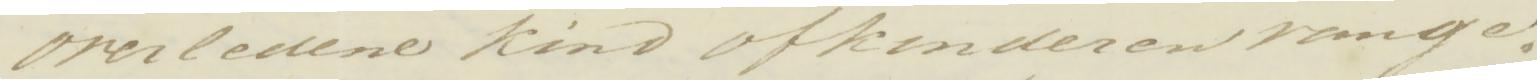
overledene kind of kinderen van ge„
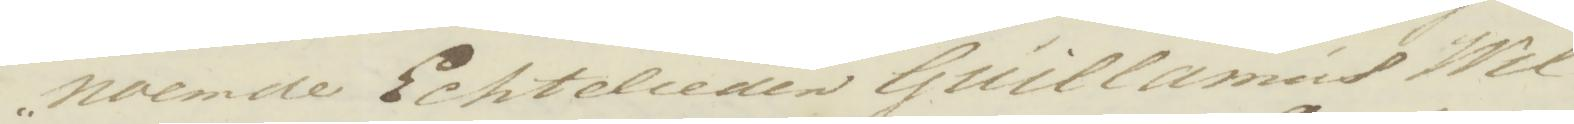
„noemde Echtelieden Guillamus Wil
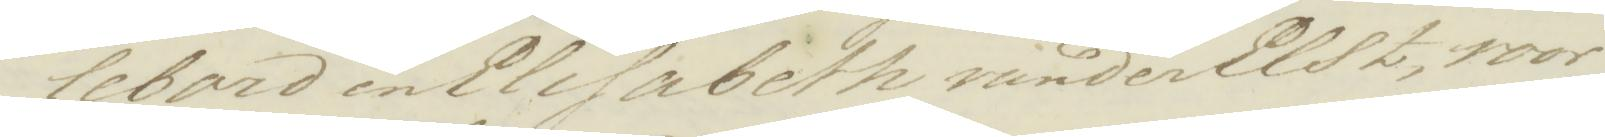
lebord en Elisabeth van der Elst, voor
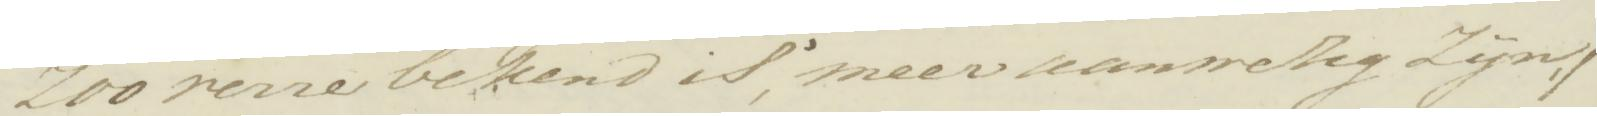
zoo verre bekend is, meer aanwezig zijn, /
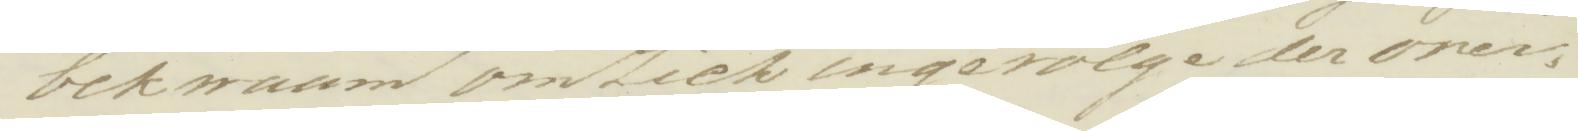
bekwaam om zich ingevolge der over„
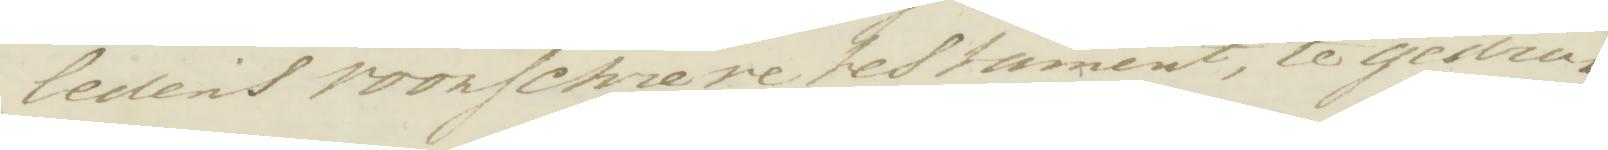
ledens voorschreve Testament, te gedra„
